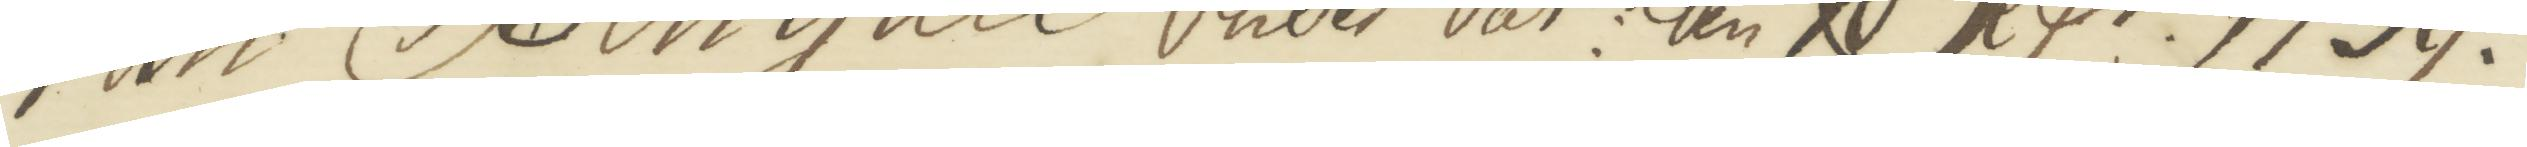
Van Bengale Onder dat: den 10 Sept: 1739.
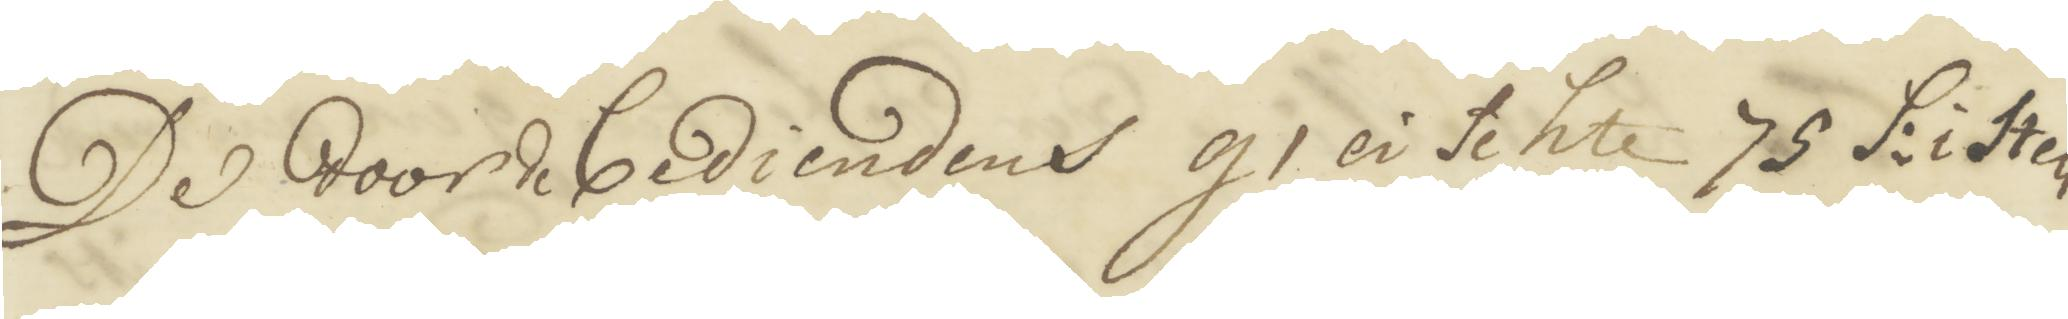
De door de bediendens g' eischte 75 kisten
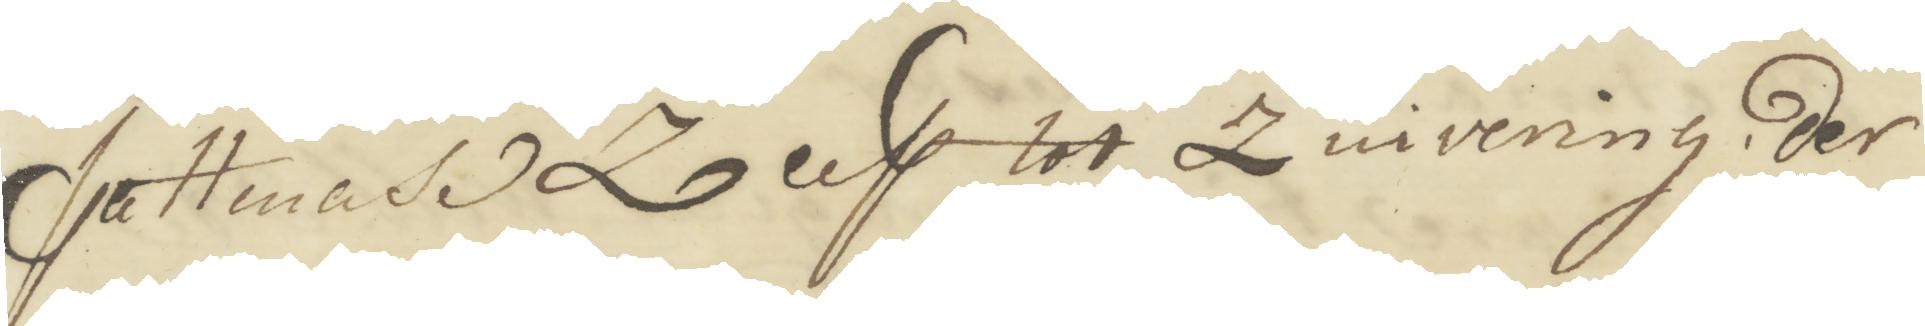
pattenase Zeep tot zuivering der
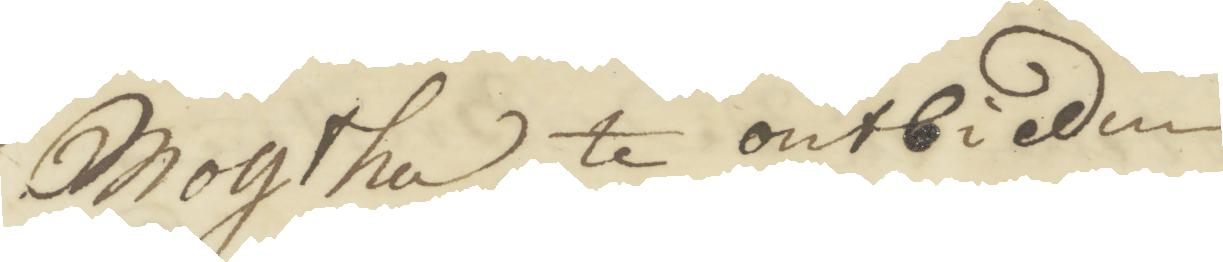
Mogtha te ontbieden
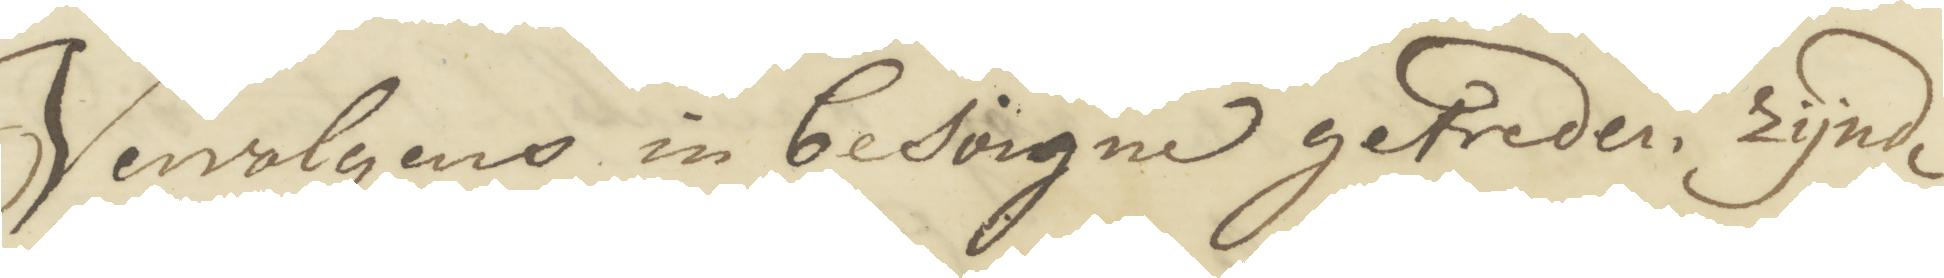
Vervolgens in besoigne getreden zijnde
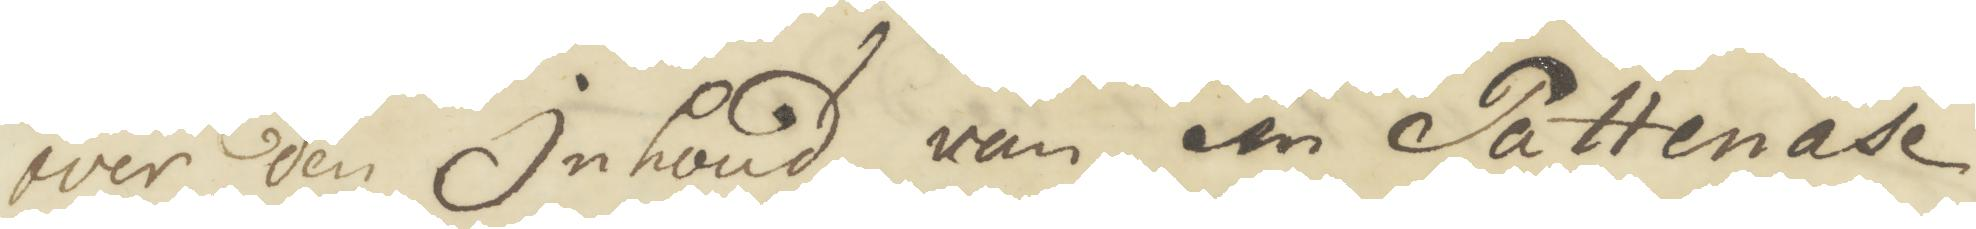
over den Jnhoud van een Pattenase
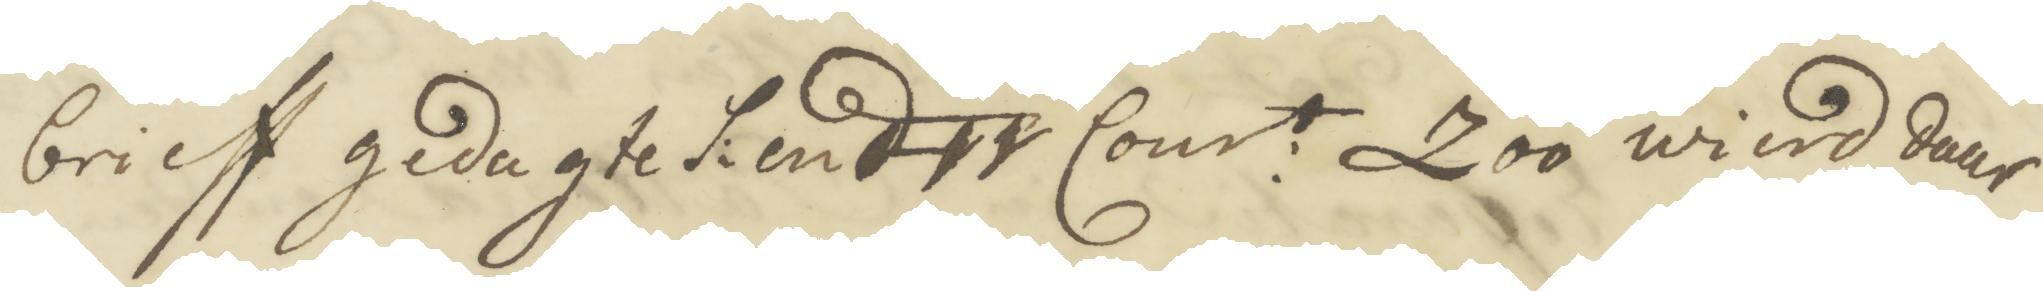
brieff gedagte kend 11 Cour:t zoo wierd daar
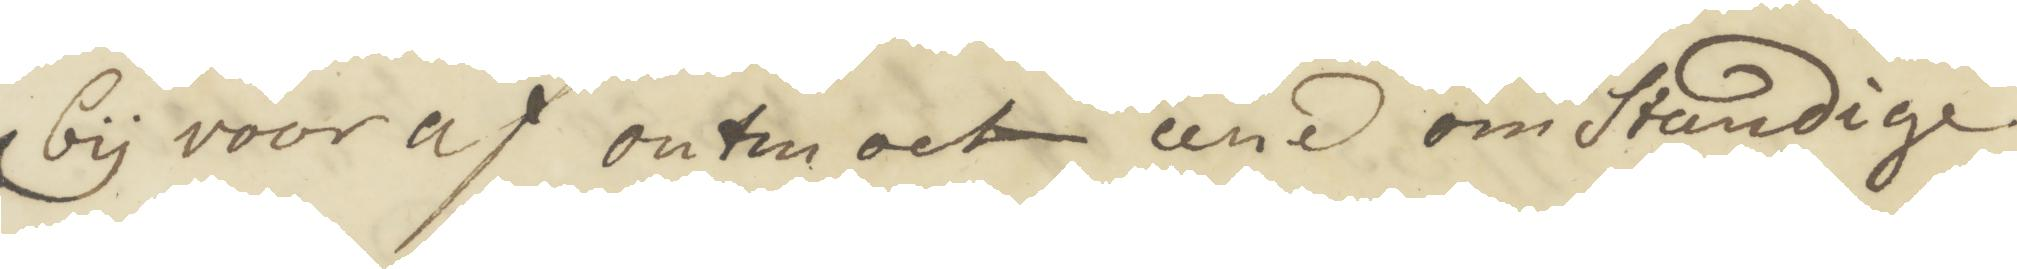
bij voor af ontm oet eene omstandige
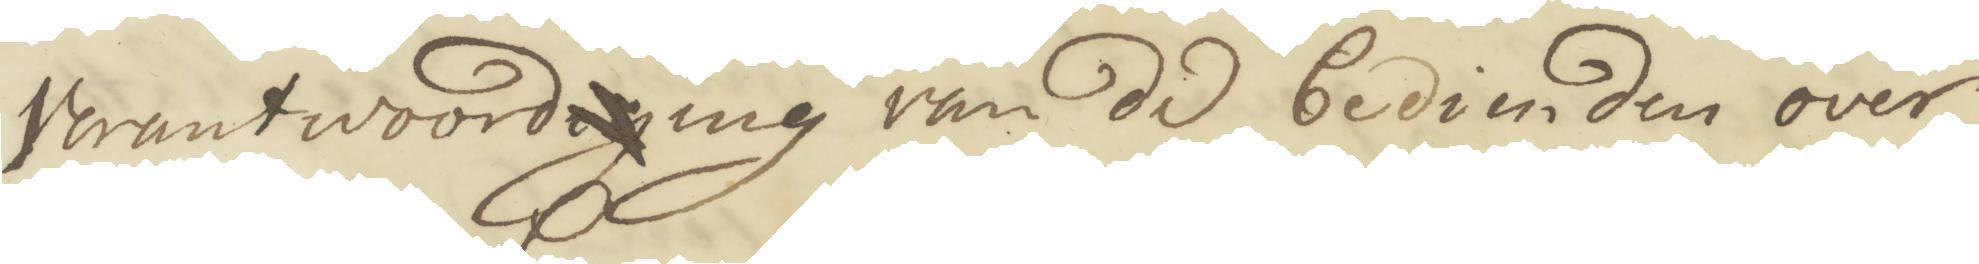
verantwoordiging van de bedienden over
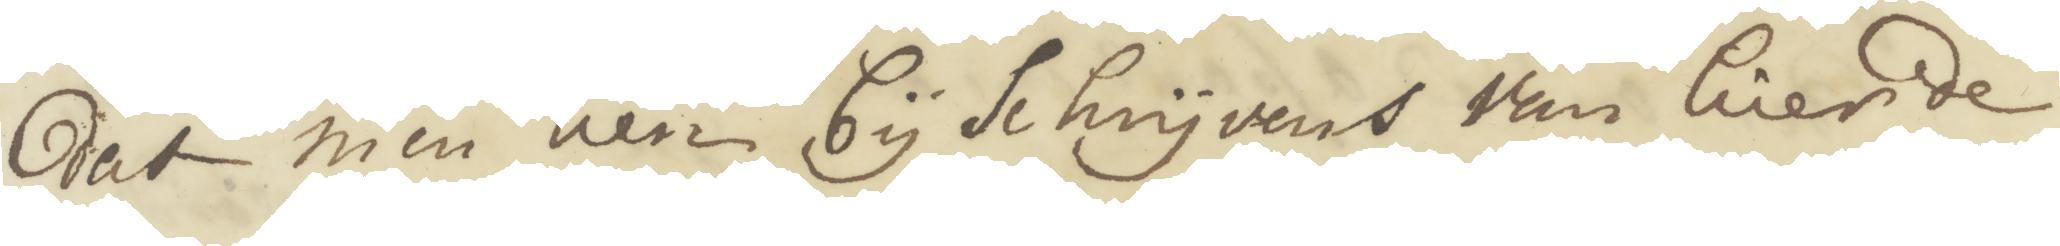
dat men hen bij schrijvens van hier de
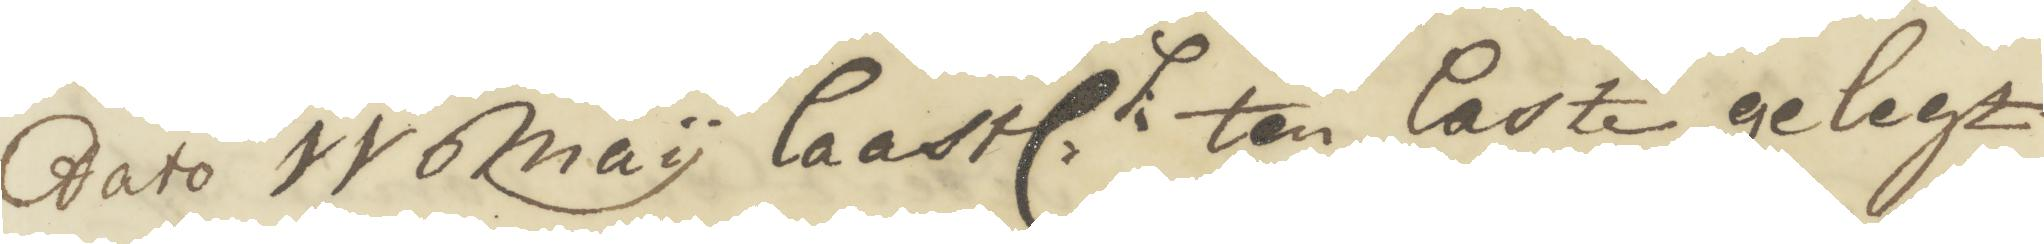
dato 11 Maij laastC:t ten laste gelegt
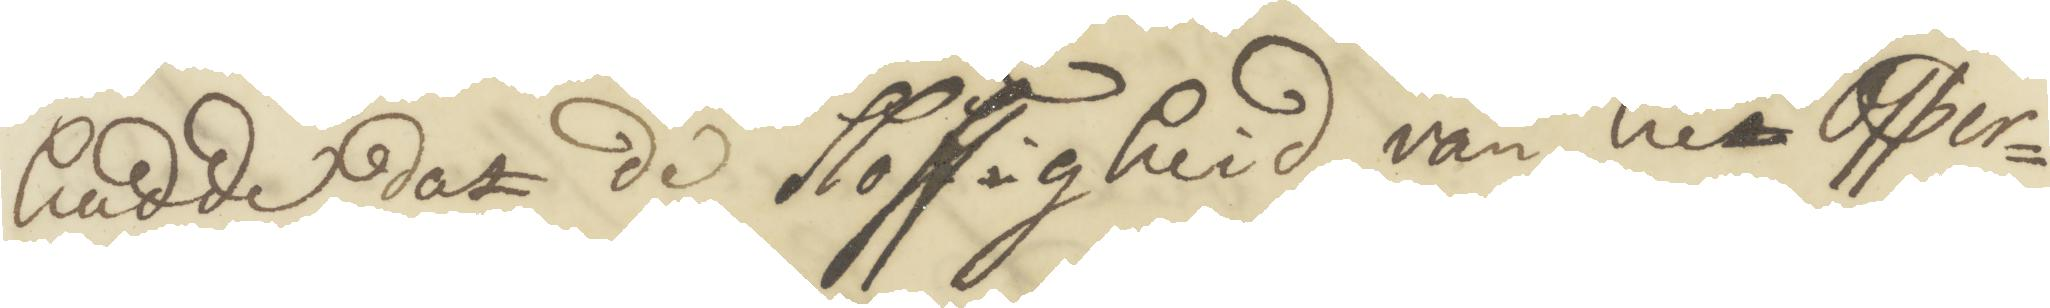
hadde dat de sloffigheid van het opper„
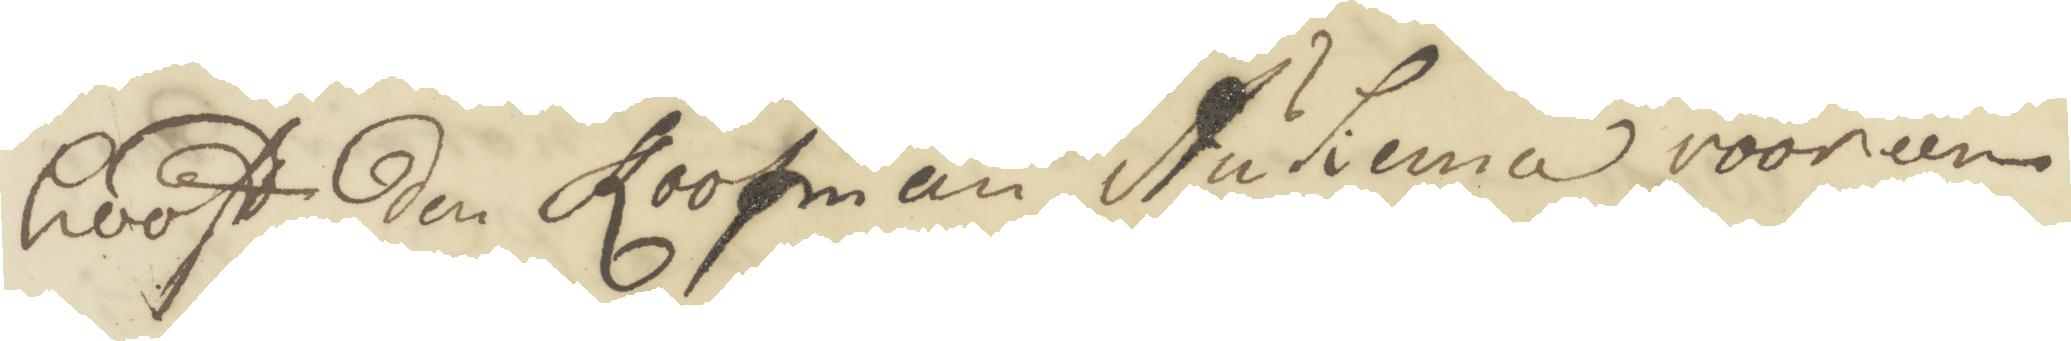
hoofd den koopman Aukema voor een
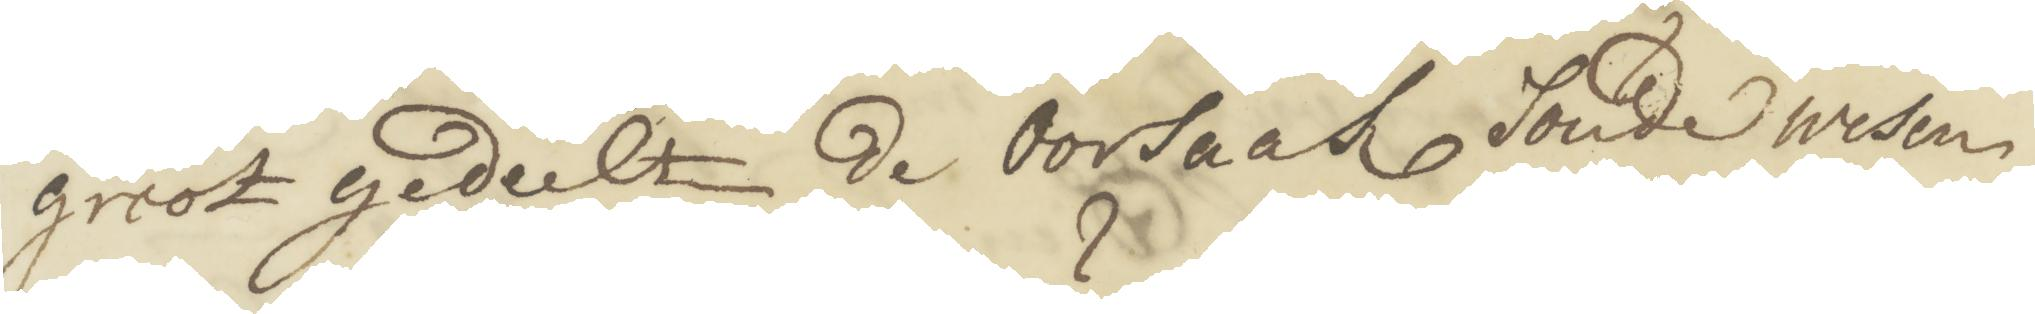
groot gedeelt de oorsaak soude wesen
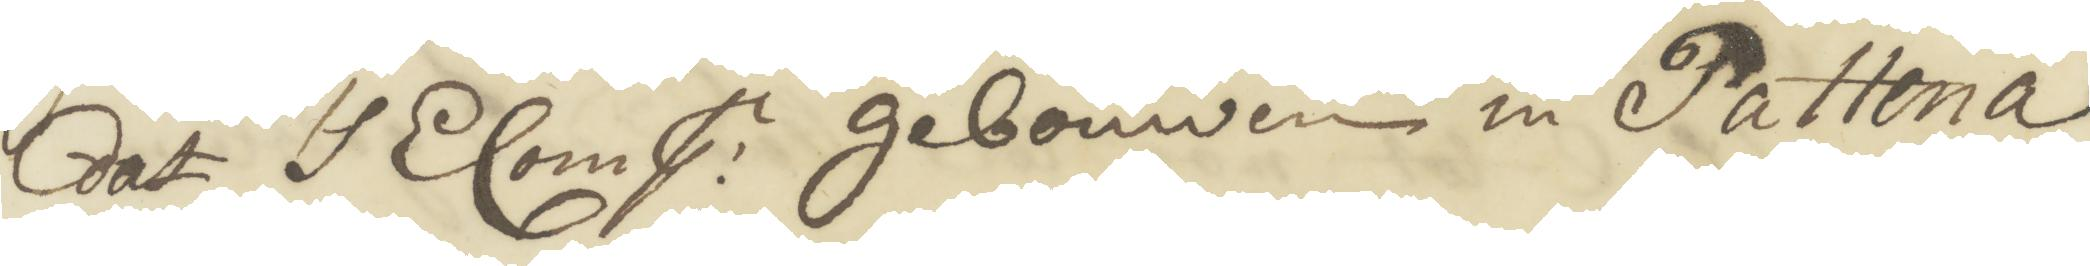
dat ’s E Comp: gebouwen in Pattena
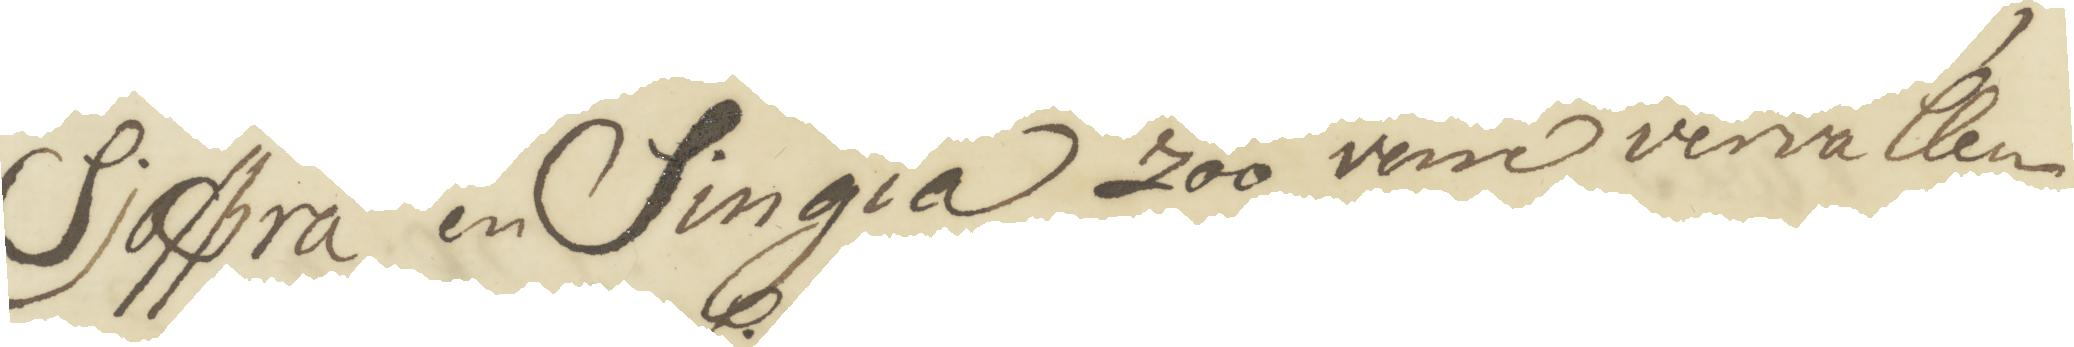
Sjoppra en Singia zoo verre vervallen
